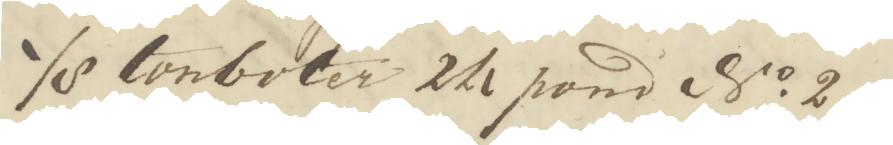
1/8 tonboter 24 pond N.o 2 -
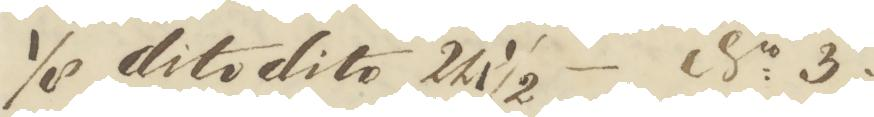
1/8 dito dito 24½ — N:o 3
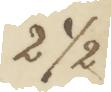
2½
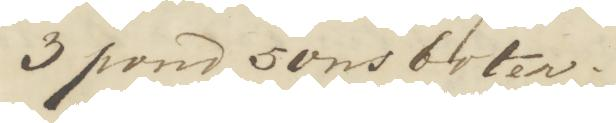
3 pond 5ons boter
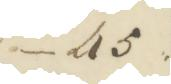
— 45„
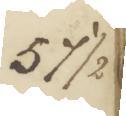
57½
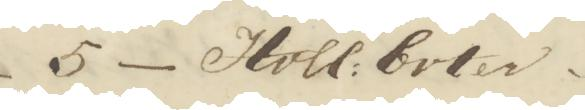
5 — Holl: boter
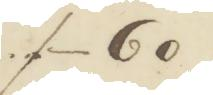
ƒ 60
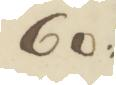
60:
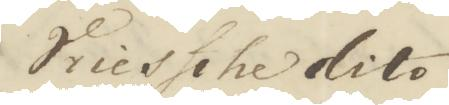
Vriessche dito
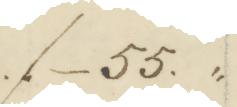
ƒ — 55. „
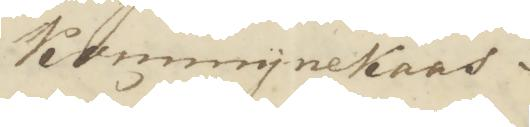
Kommijnekaas.
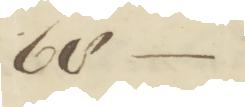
68 —
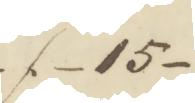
ƒ— 15–
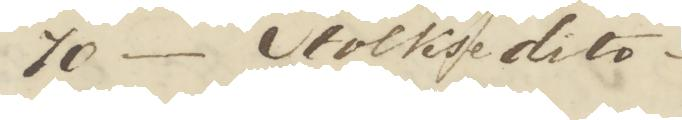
70 — stolkse dito -
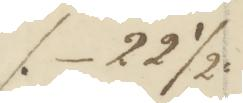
ƒ— 22½
